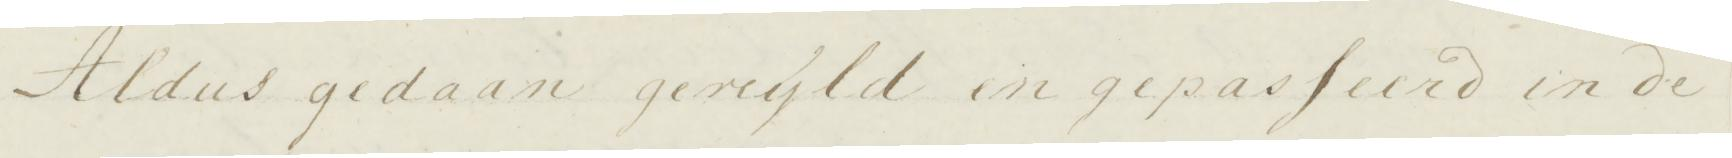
Aldus gedaan geveijld en gepasseerd in de
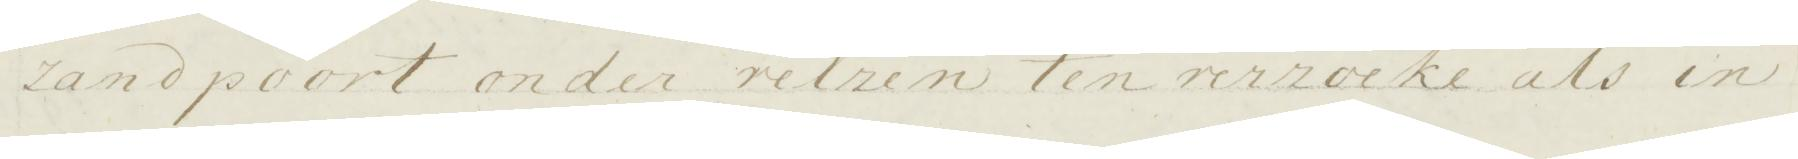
zandpoort onder velzen ten verzoeke als in
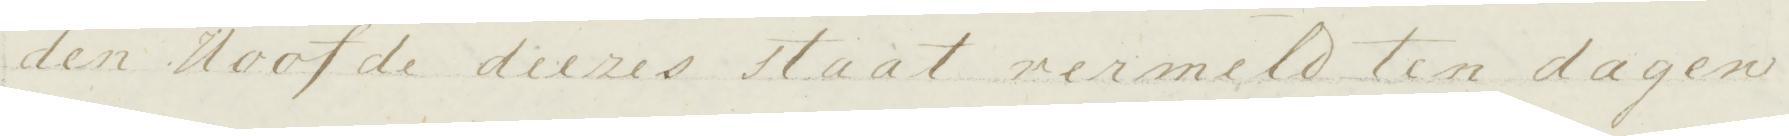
den Hoofde deezes staat vermeld ten dagen
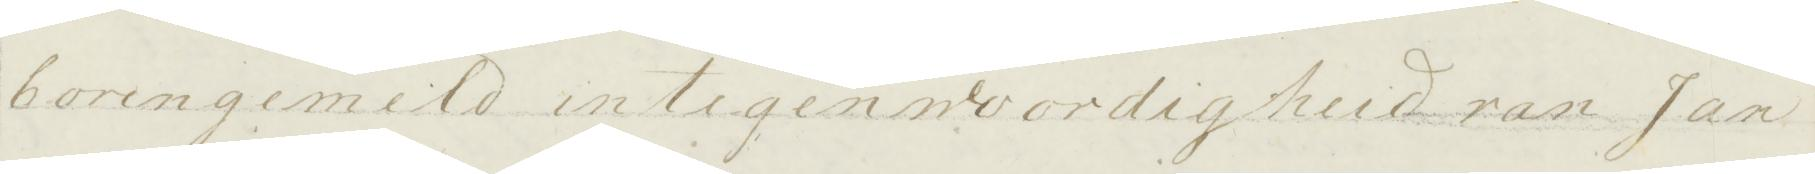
bovengemeld in tegenwoordigheid van Jan
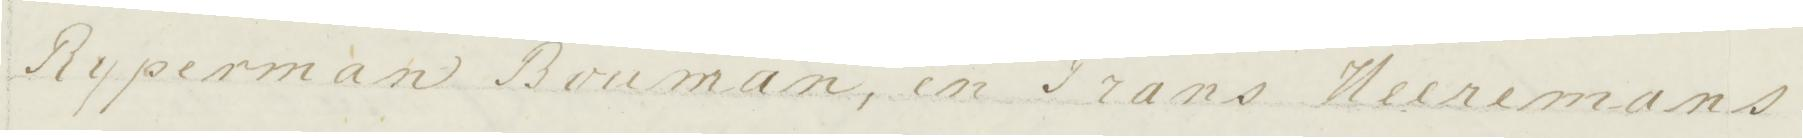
Ryperman Bouman, en Frans Heeremans
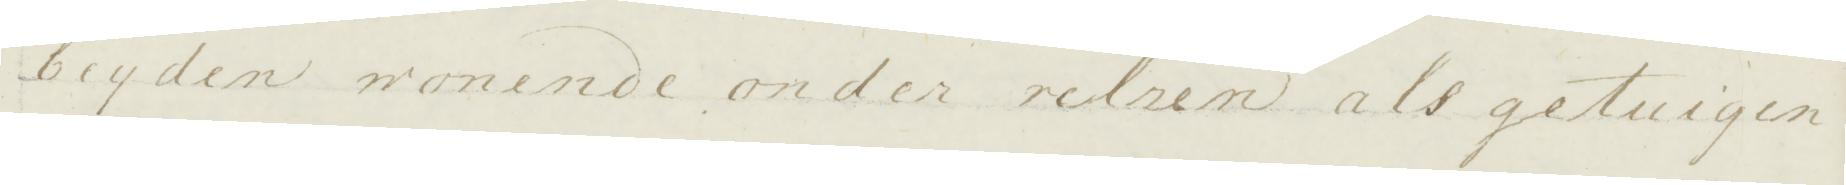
beyden wonende onder velzen als getuigen
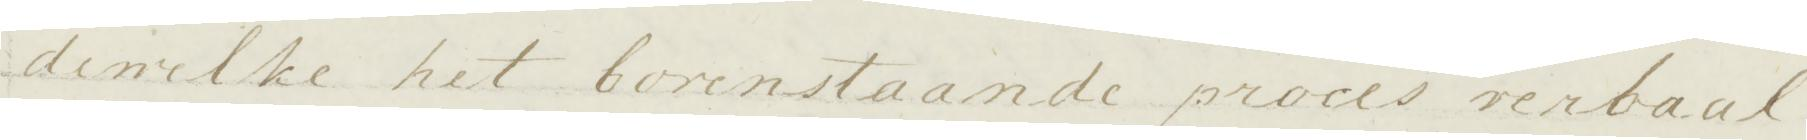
dewelke het bovenstaande proces verbaal
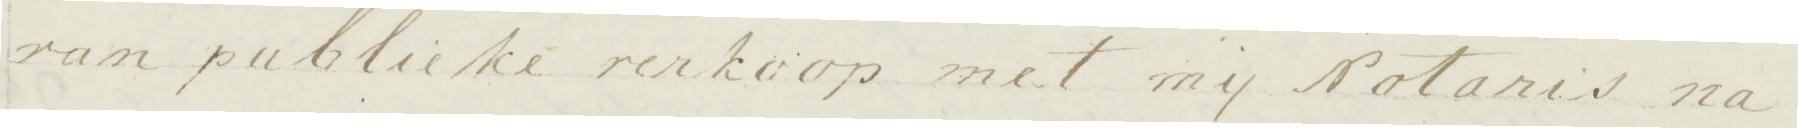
van publieke verkoop met mij Notaris na
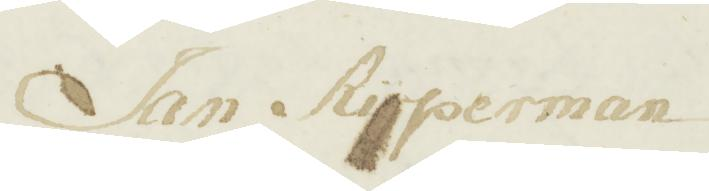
Ian Rijperman
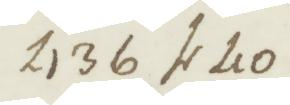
436 4 40
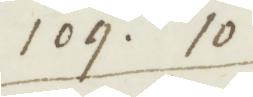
109. 10
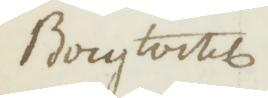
Borgtocht
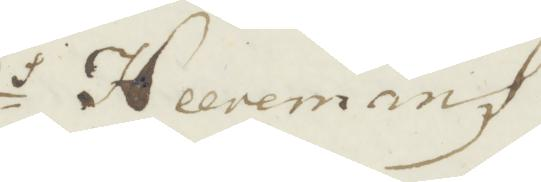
F=s Heeremans
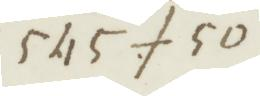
545 ƒ50
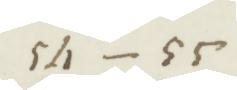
54 — 55
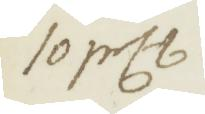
10 prct
